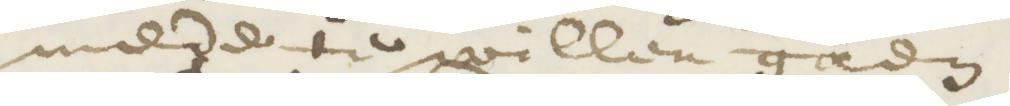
mede te willen gaen, dat hy gev.e
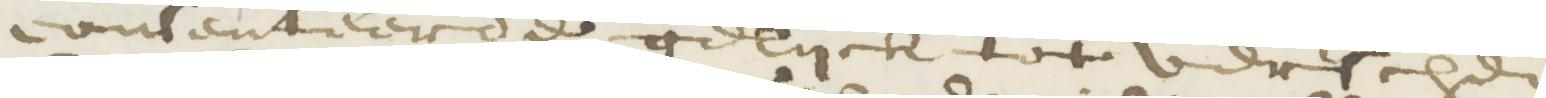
consenteerde, gelyck tot verscheyde
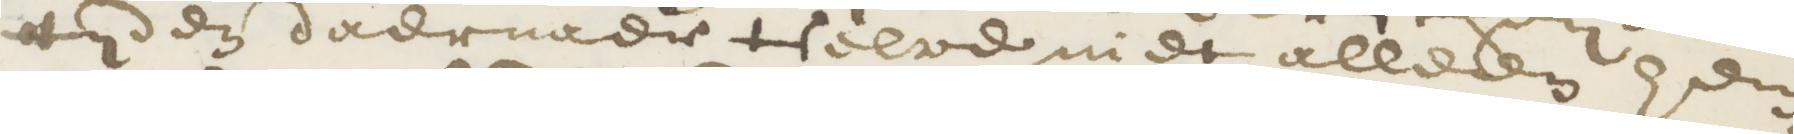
tyden daernaer tselve niet alleen hem
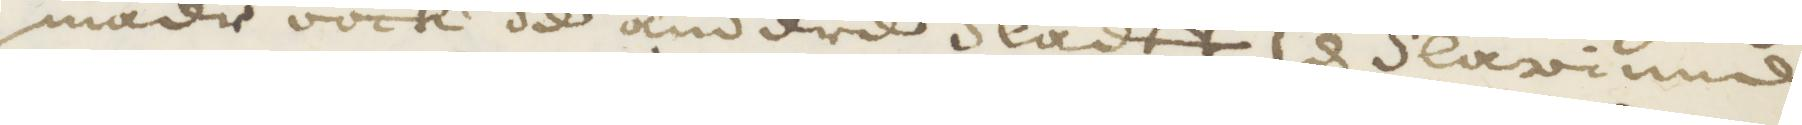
maer oock de andere slaeff ende slavinne
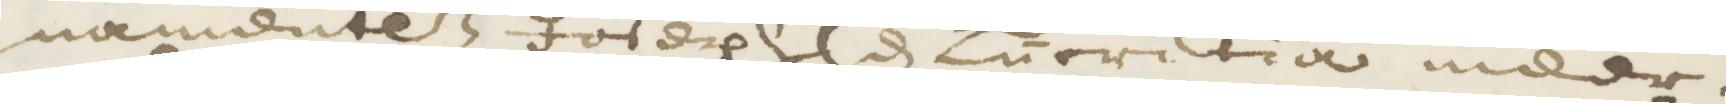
namentlijk Ioseph ende Lucretia meer„
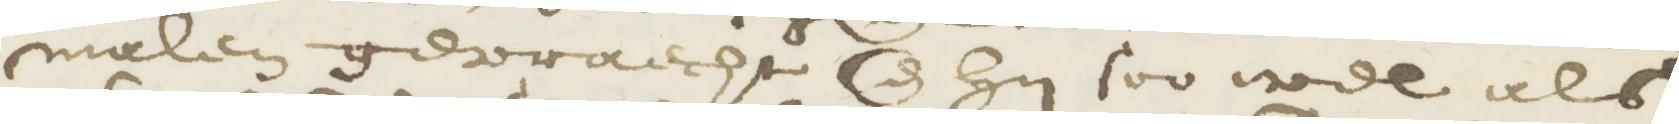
malen gevraecht ende hy soo wel als
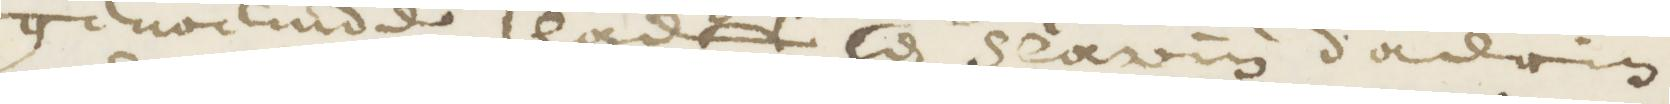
genoemde slaeff ende slavin daerin
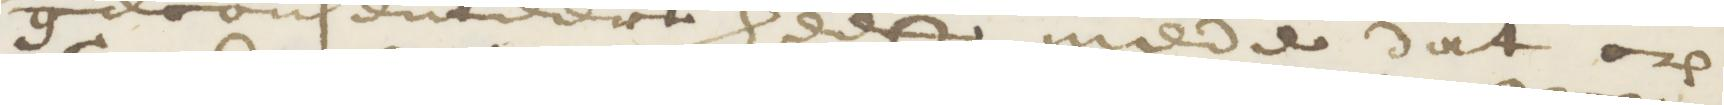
geconsenteert heerde mede dat op
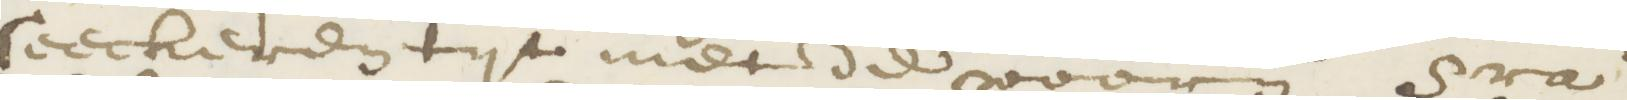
seeckeren tyt met de voorn s.ra
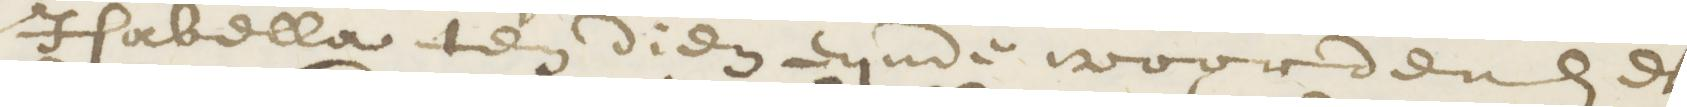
Isabella ten dien eynde woorden heb
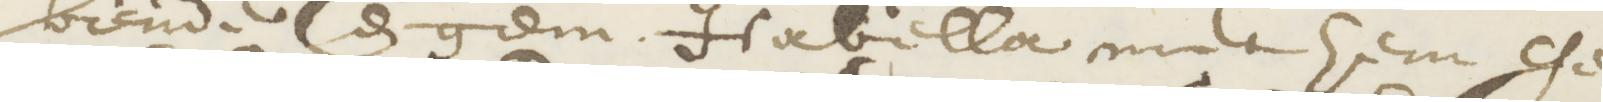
bende ende gem: Isabella met hem gev.e
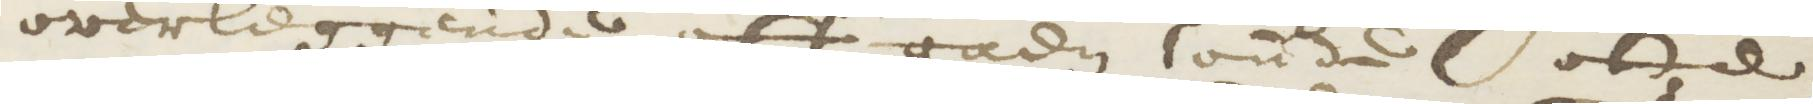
overleggende oft gaen soude ofte
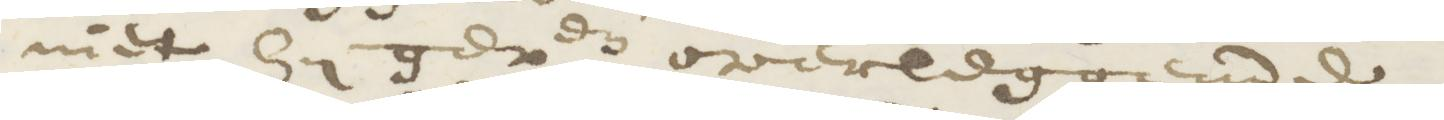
niet, hy gev.en overleggende, oft
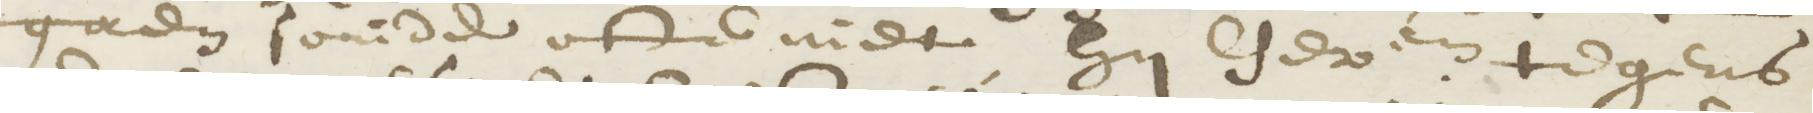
gaen soude of niet, hy gev.en tegens
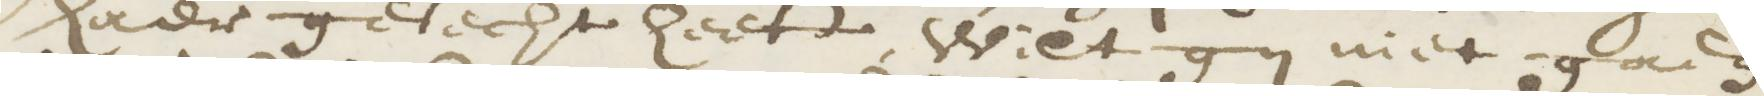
haer gesecht heeft, wilt gy niet gaen
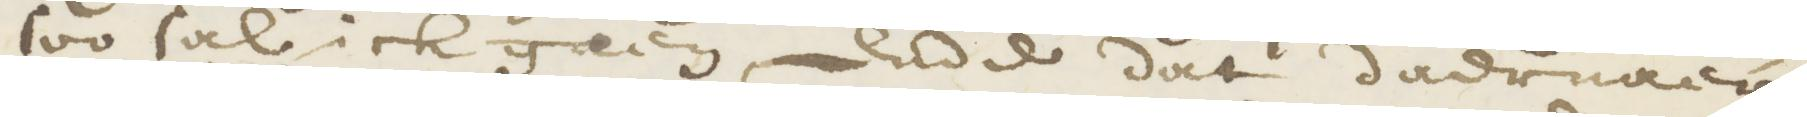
soo sal ick geen, Ende dat daernaer
